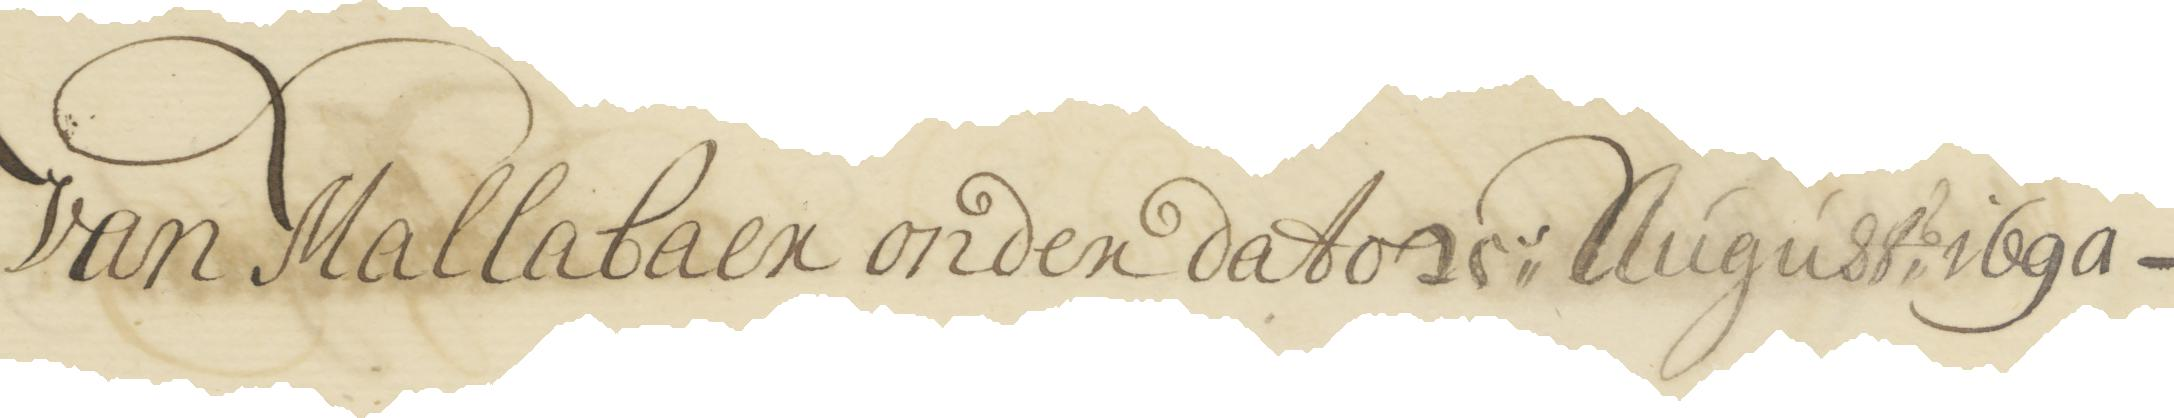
Van Mallabaer onder dato 25„e August„s 1694
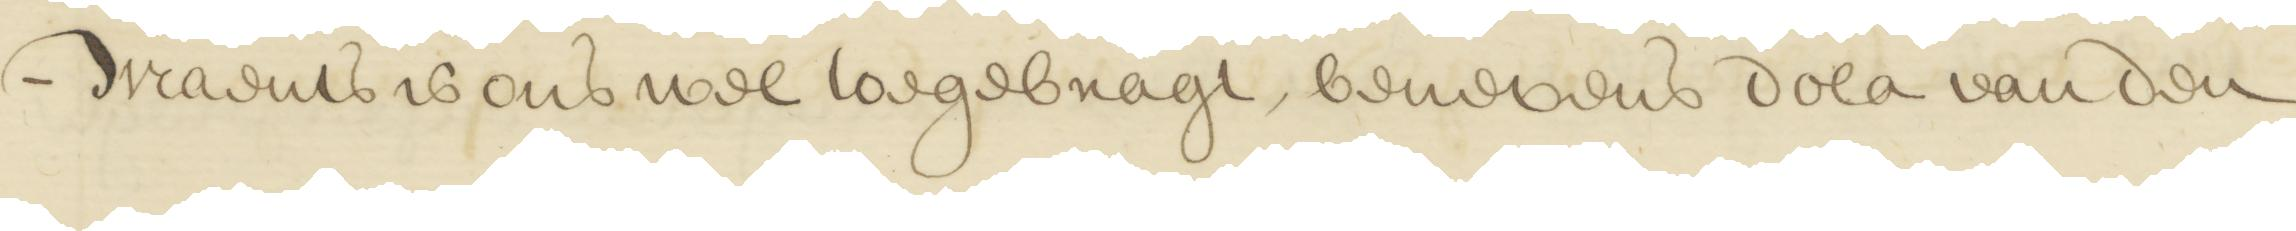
Maents is ons wel toegebragt, benevens d'ola van den
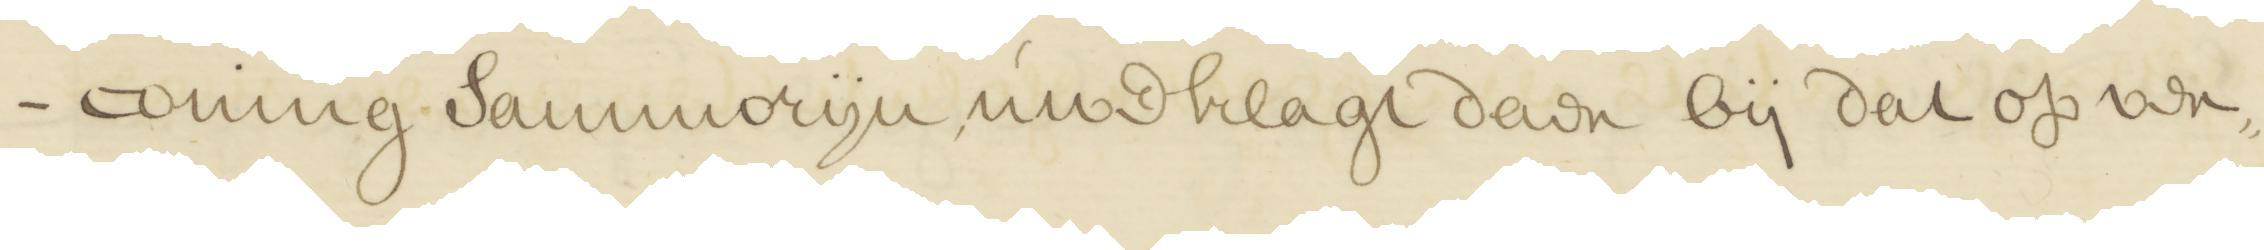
coning Sammorijn, uwe klagt daer bij dat op ver„
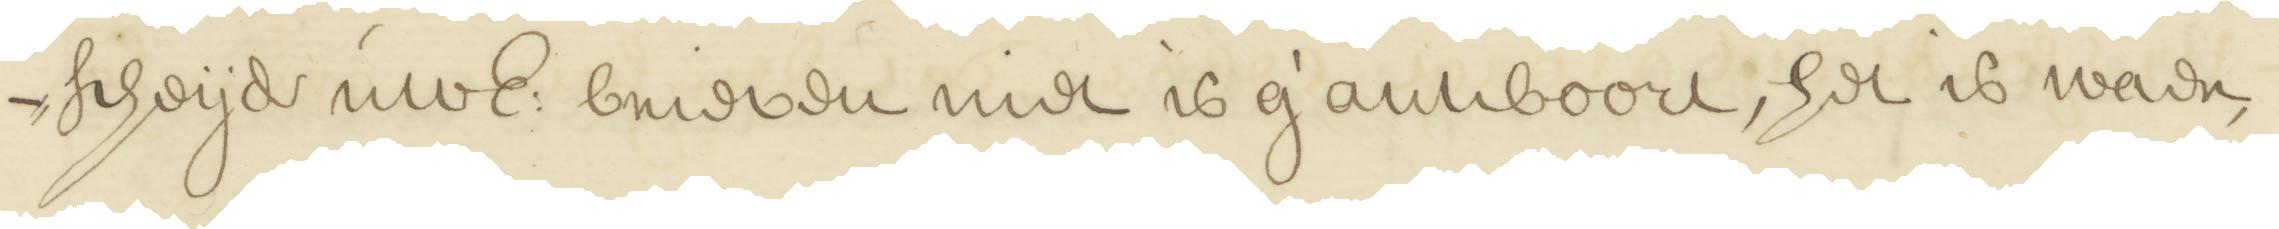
„scheijde uw E: brieven niet is g’antwoort, het is waer,
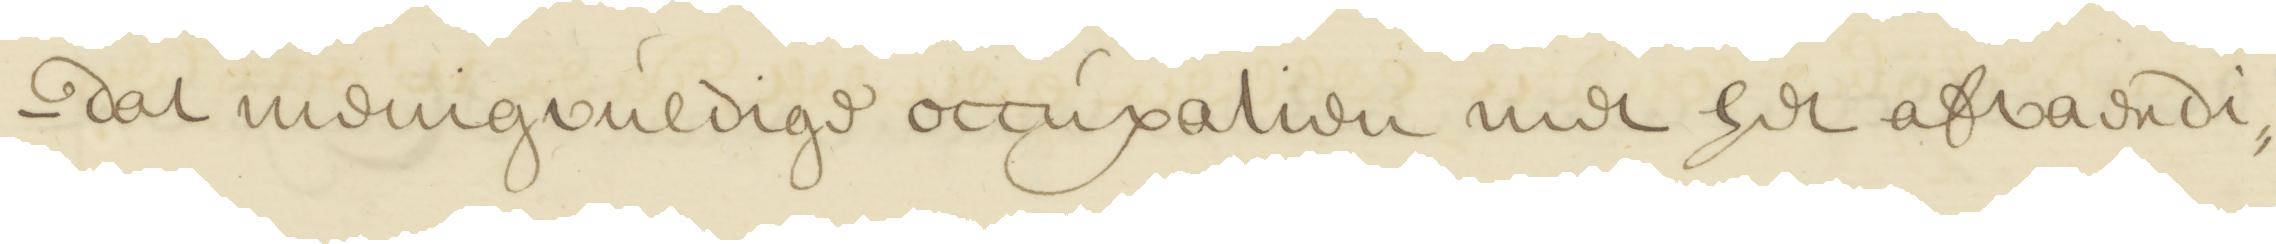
dat menigvuldige occupatien met het afvaerdi„
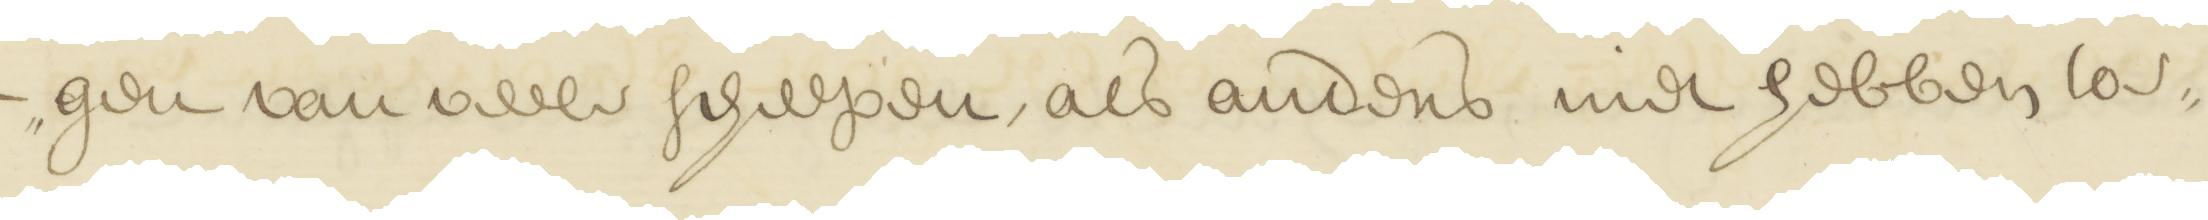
„gen van veele scheepen, als anders niet hebben toe„
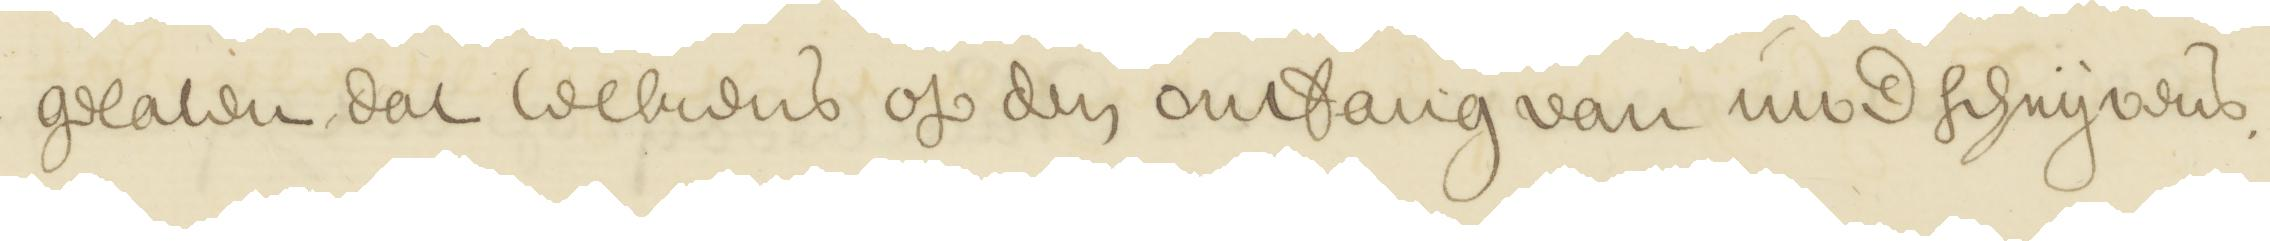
gelaten, dat telkens op den ontfang van uw E schrijvens
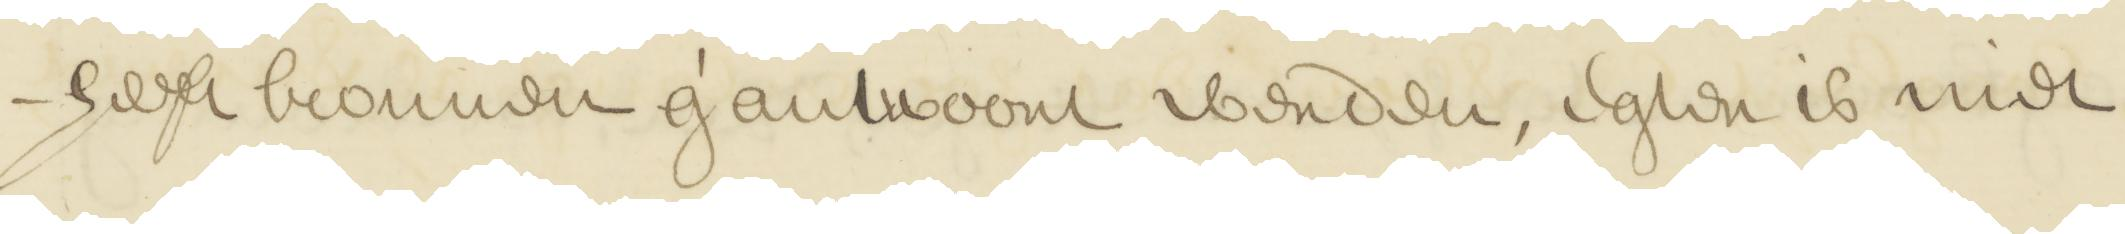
heeft konnen g’antwoort werden, egter is niet
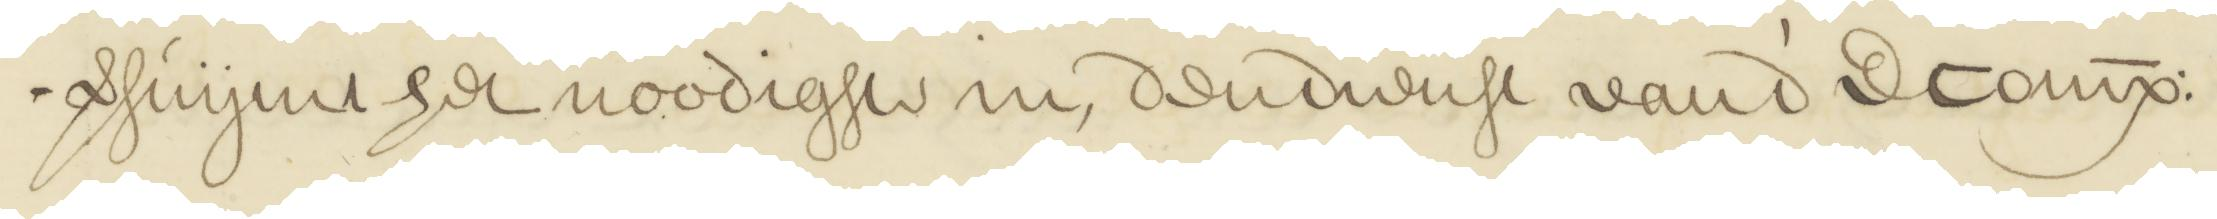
„versuijmt het noodigste in, den dienst van d’ E comp:
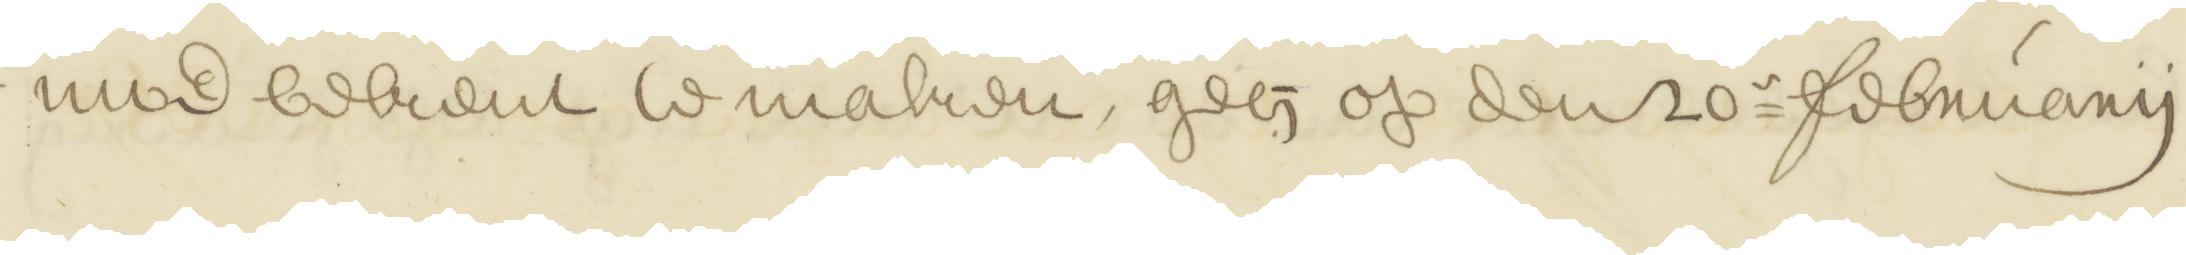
uwe bekent te maken, gelijk op den 20=e februarij
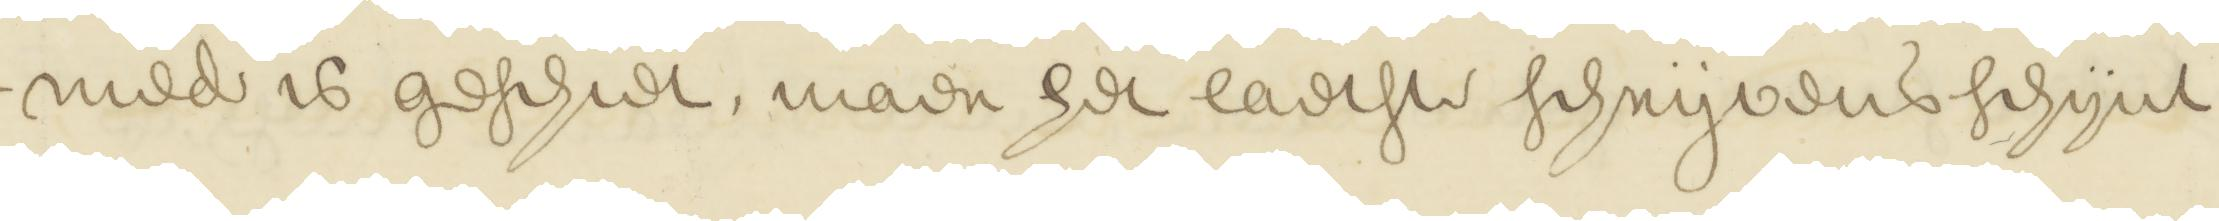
mede is geschiet, maer het laetste schrijvens schijnt
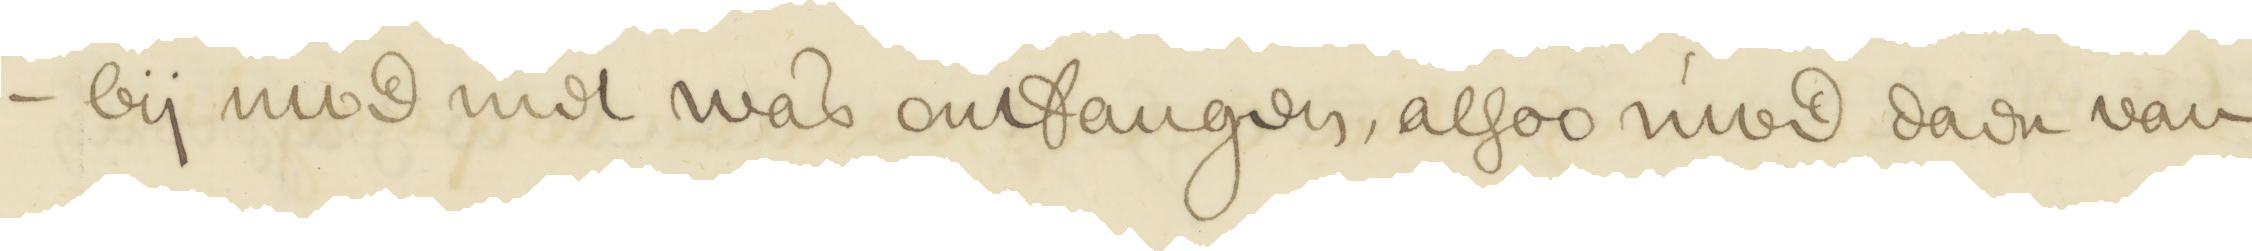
bij uw E niet was ontfangen, alsoo uwE daer van
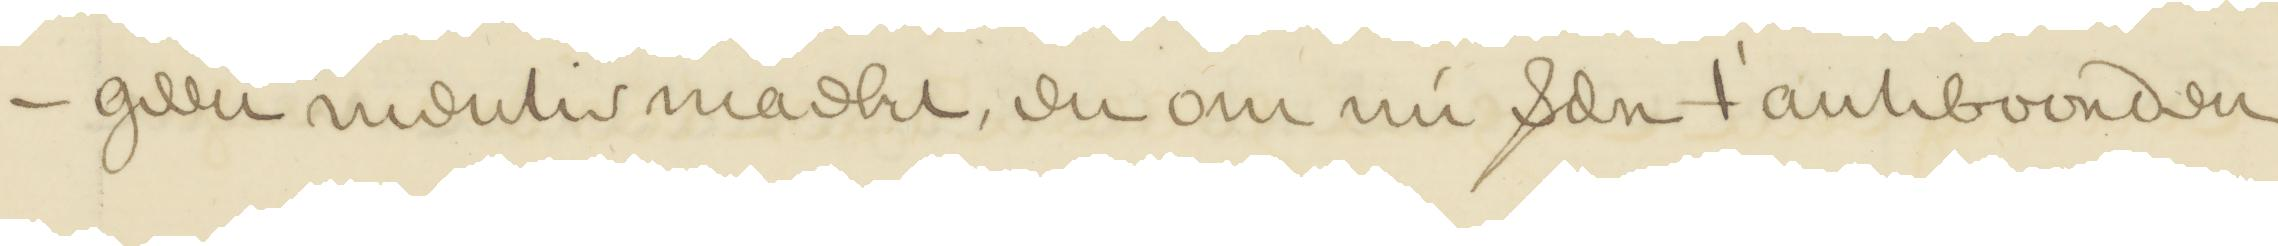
geen mentie maekt, en om nu verder t'antwoorden
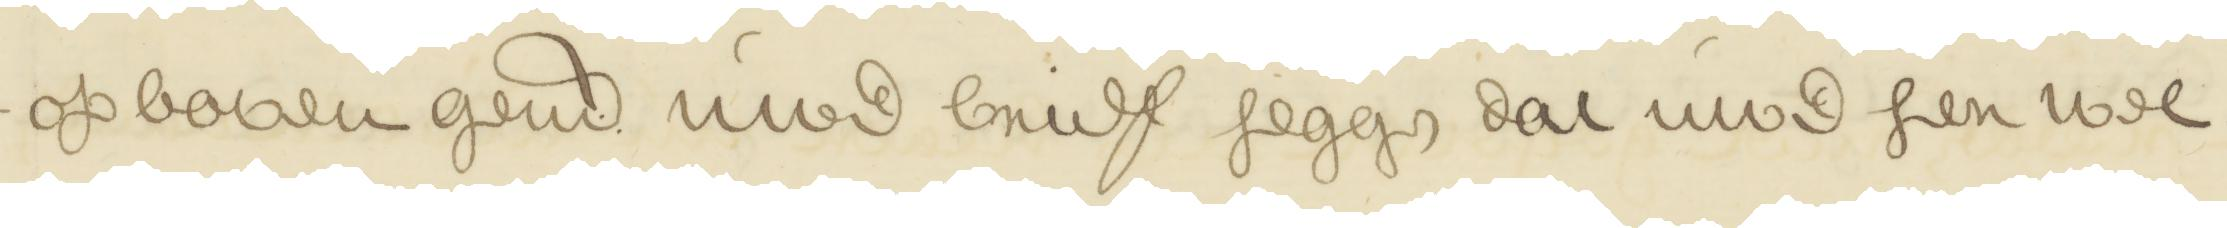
opboven gem: uwE brief seggen dat uw E ser wel
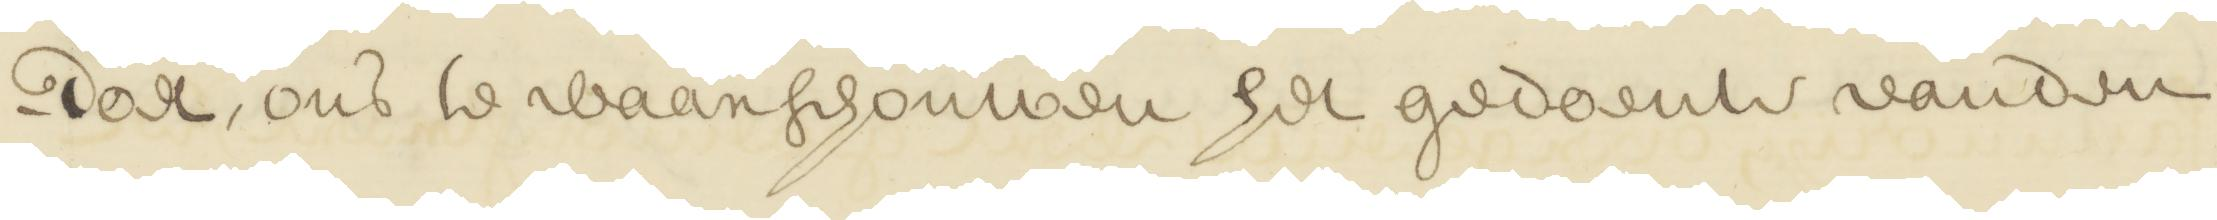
doet, ons te waarschouwen het gedoente van den
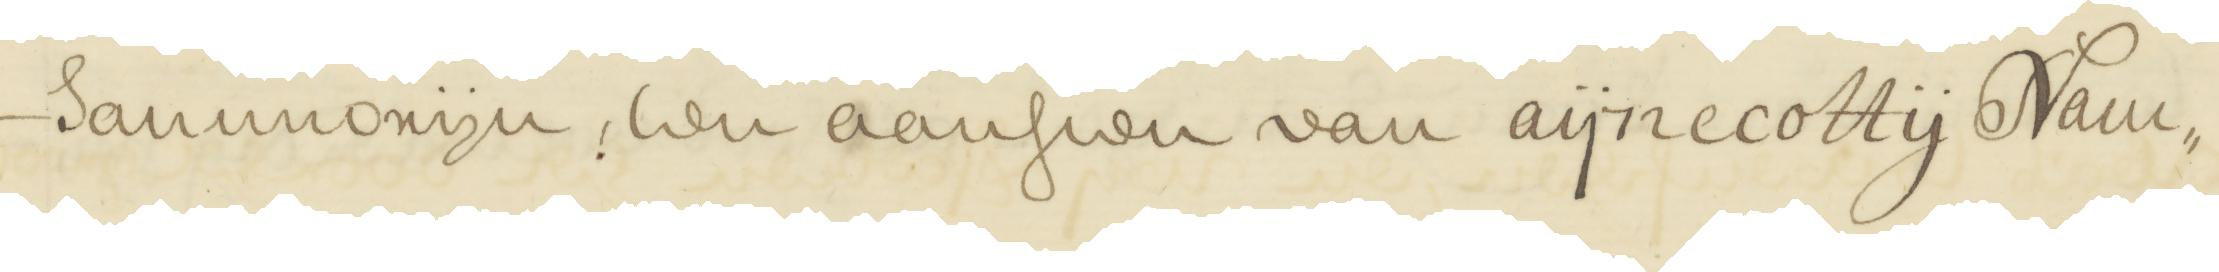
Sammorijn, ten aansien van aijnecottij Nam„
